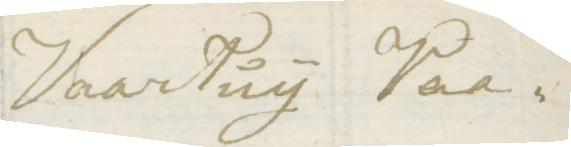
Vaartuij Vaa„
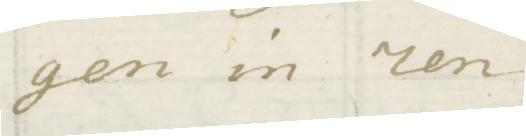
gen in ren
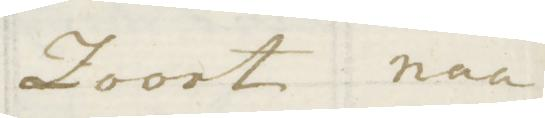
zoort naa
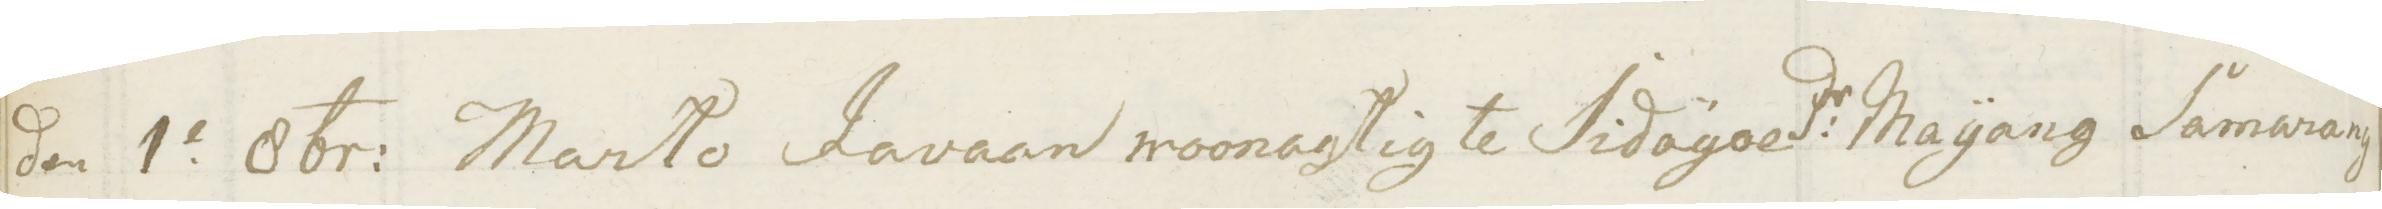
den 1:e 8br: Marto Javaan woonagtig te sidagoes:r Maijang Samarang
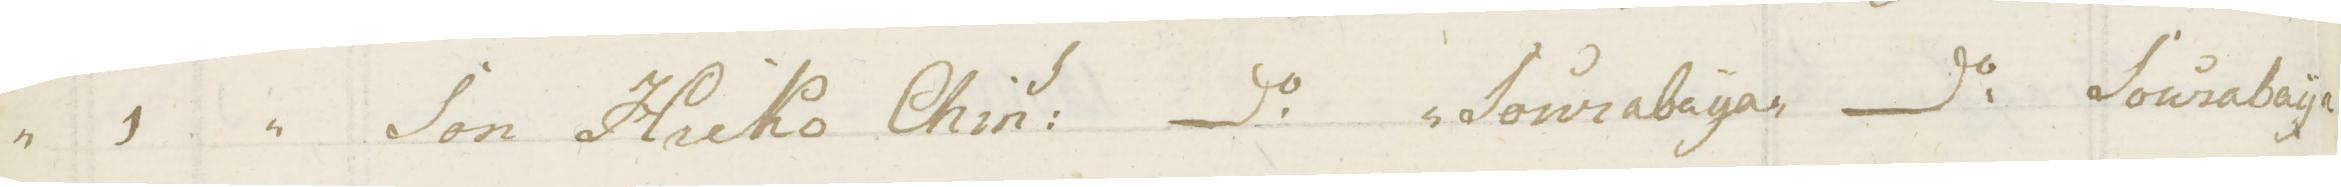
„ 1 „ son Hieko Chin:s _.o „ sourabaija „ _.o sourabaija
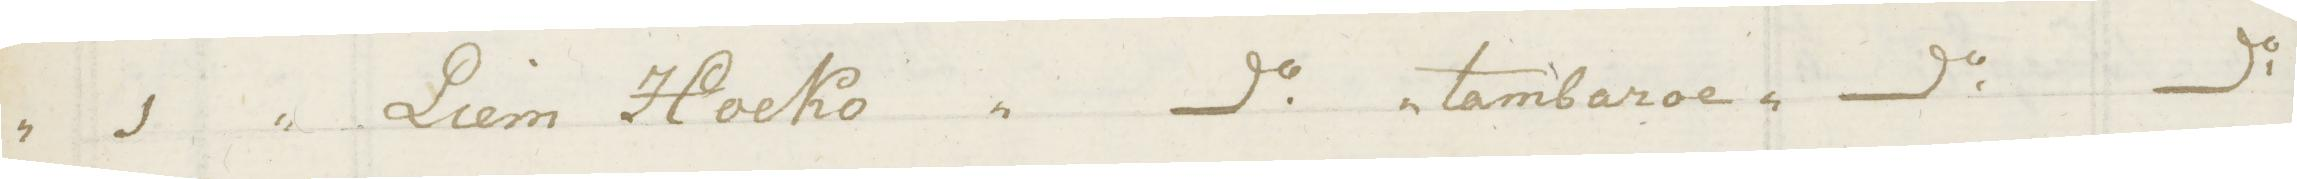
„ 1 „ Liem Hoeko „ _.o „ tambaroe „ _.o _.o
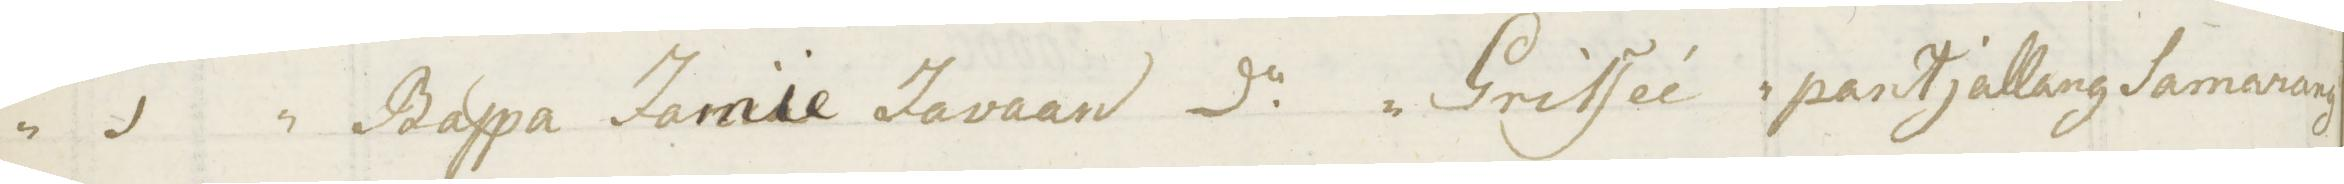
„ 1 „ Bappa Jamie Javaan _.o „ Grisseé „ pantjallang Samarang
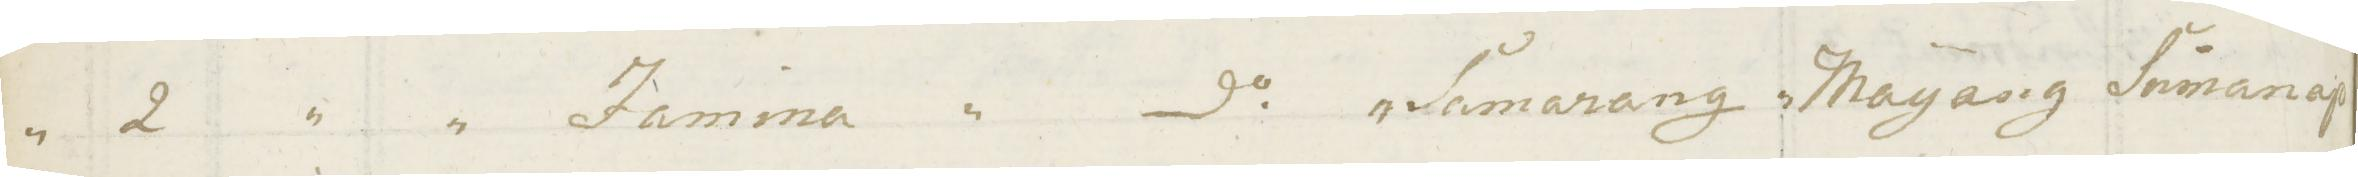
„ 2 „ „ Jamina „ _.o „ Samarang „ Maijang Samanap
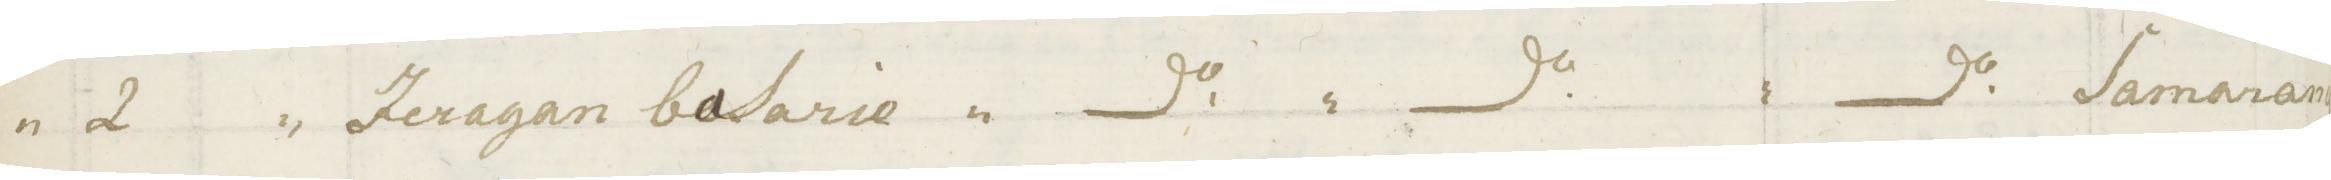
„ 2 „ Jeragan basarie „ _:o „ _:o „ _:o Samarang
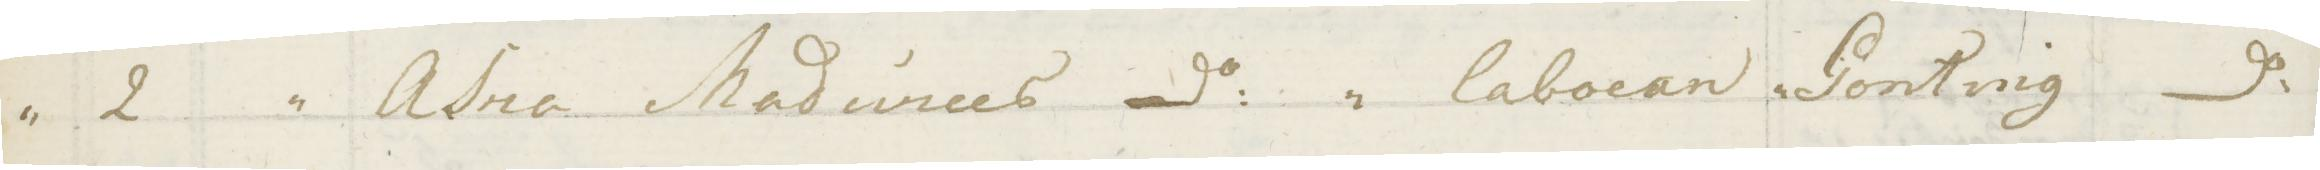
„ 2 „ Asra Madurees _:o „ laboean „ Gonting _:o
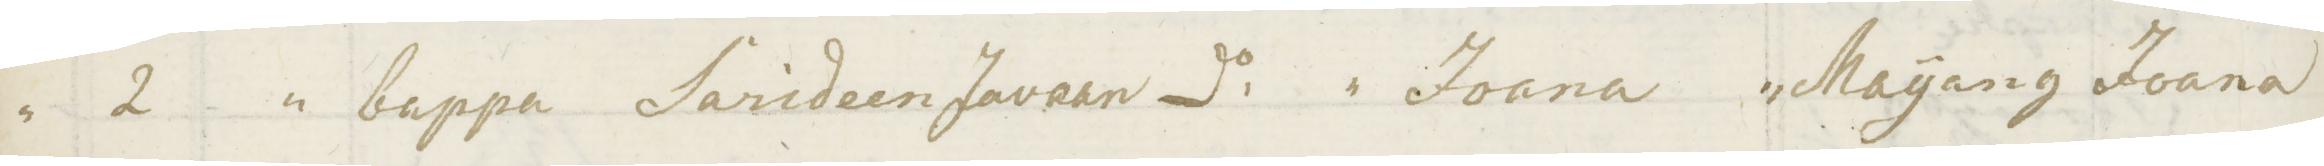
„ 2 „ bappa sarideen Javaan _:o „ Joana „ Maijang Joana
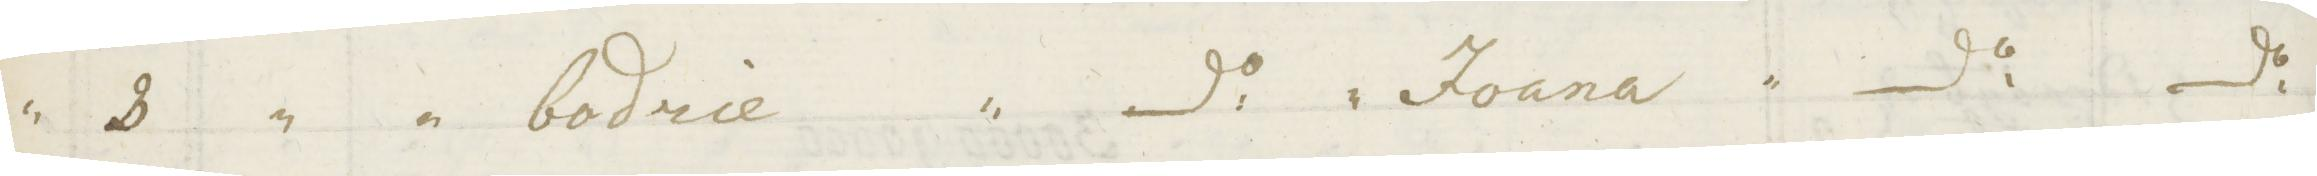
„ 2 „ „ bodrie „ _:o „ Joana „ _:o _:o
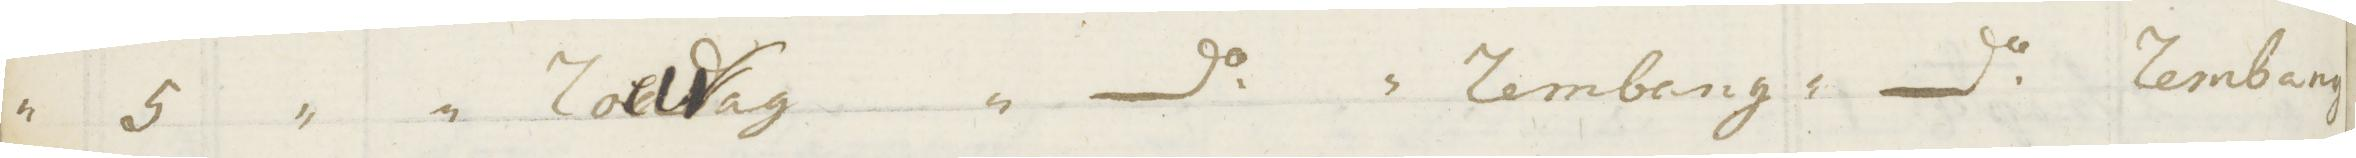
„ 5 „ „ rolwag „ _:o „ rembang „ _:o rembang
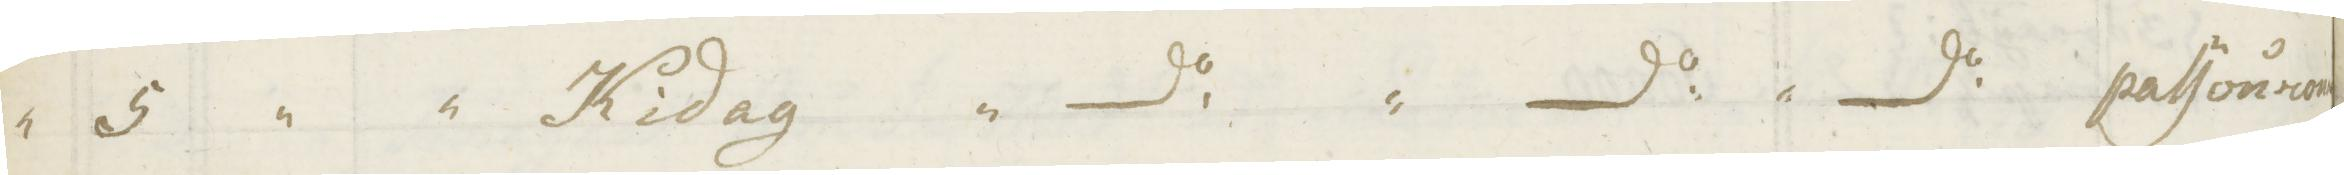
„ 5 „ „ Kidag „ _:o „ _:o „ _:o passouran
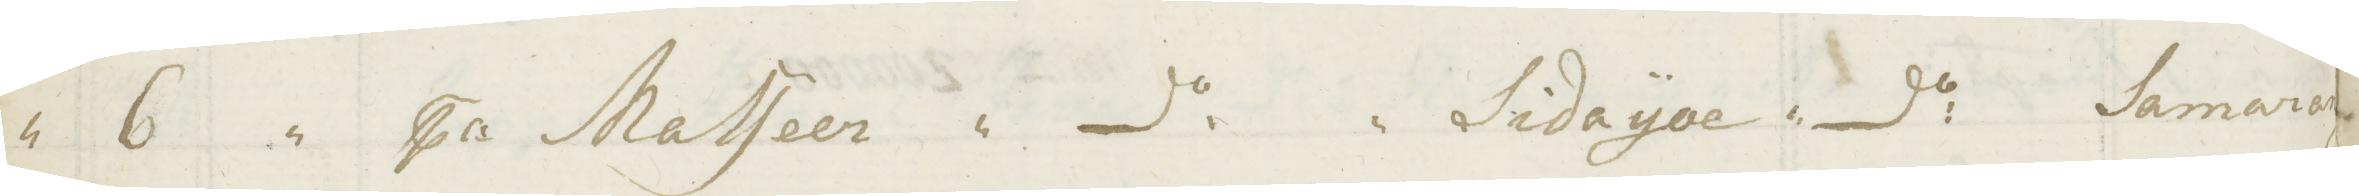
„ 6 „ pa Masseer „ _:o „ sidaijoe „ _:o samara
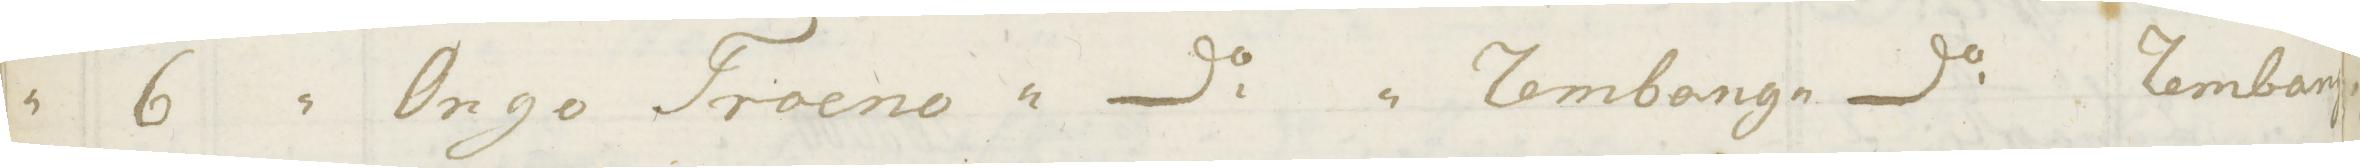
„ 6 „ Ongo Troeno „ _:o „ rembang „ _.o rembang
